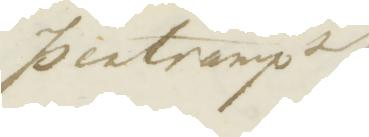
Per transpt ƒ
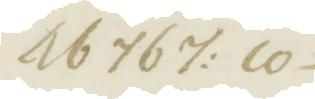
46767: 10 —
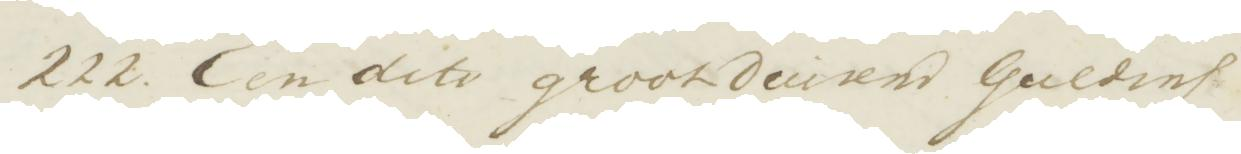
222. Een dito groot duisend Guldens
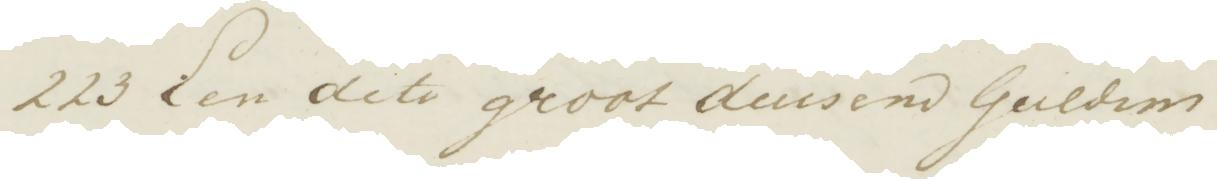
223 Een dito groot duisend Guldens
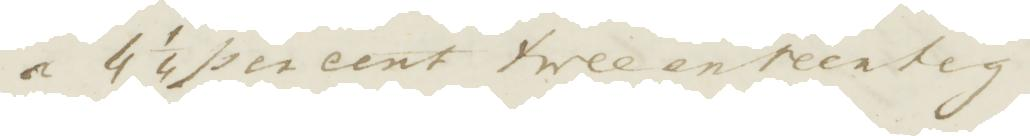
a 4¼ per cent twee en veertig
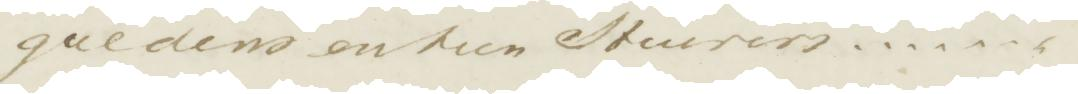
guldens en tien stuivers - - - - - - „
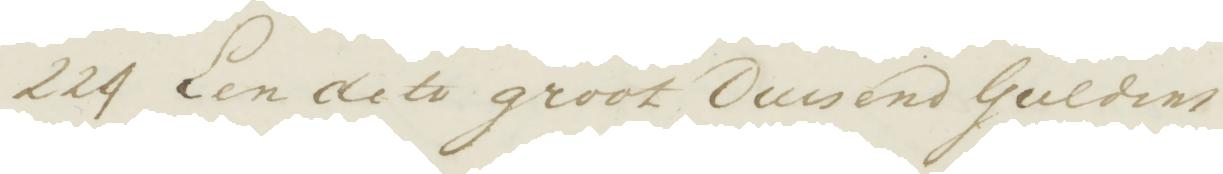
224 Een dito groot Duisend Guldens
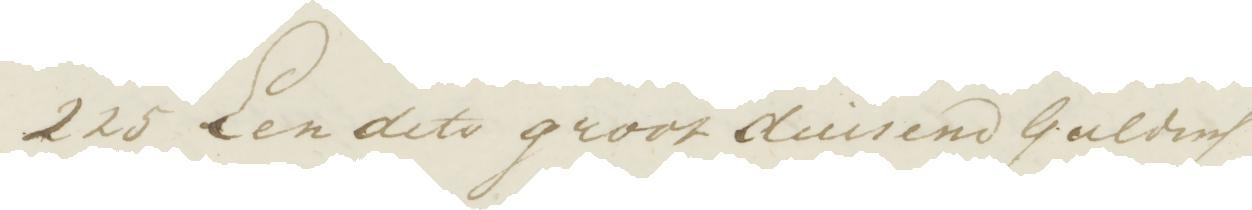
225 Een dito groot duisend Guldens
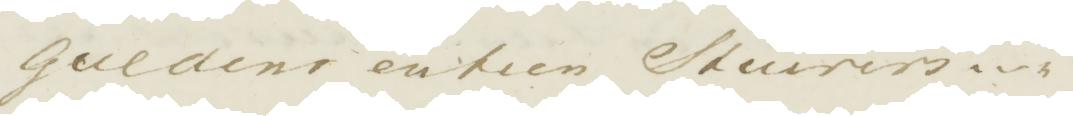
Guldens en tien Stuivers - - „
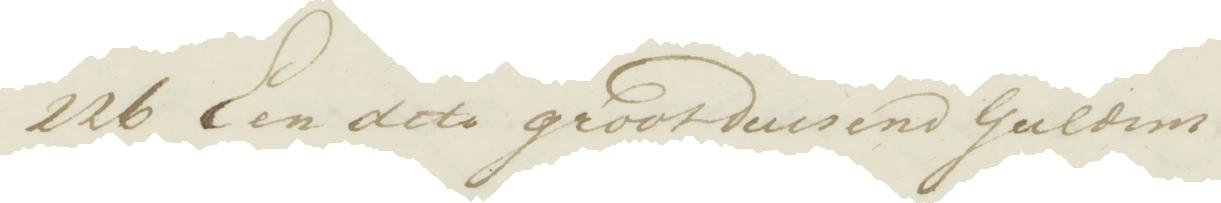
226 Een dito groot duisend Guldens
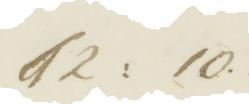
42: 10. —
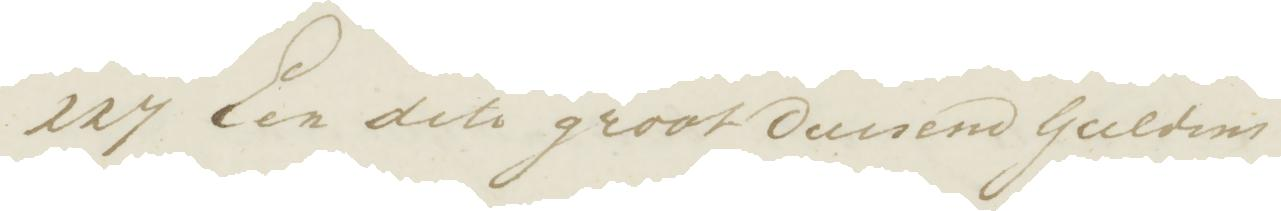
227 Een dito groot duisend Guldens
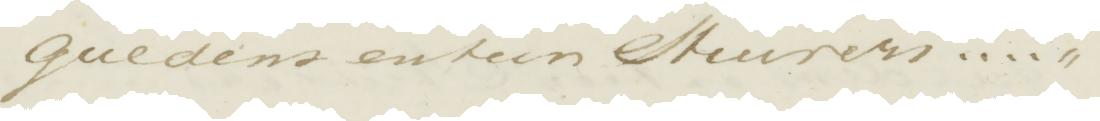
Guldens en tien stuivers - - - - „
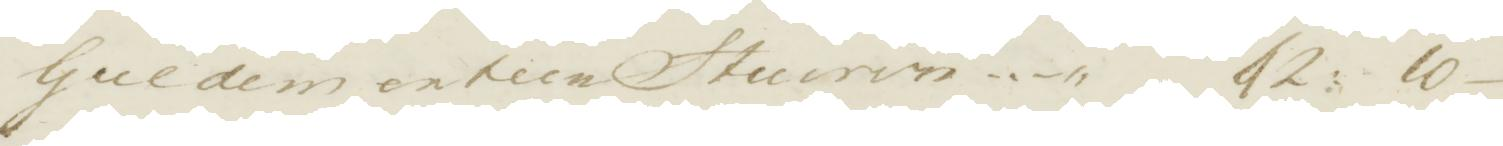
Guldens en tien Stuivers - - - „ 42: 10 —
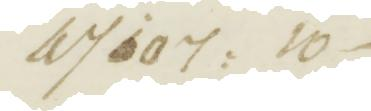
47107: 10 —
